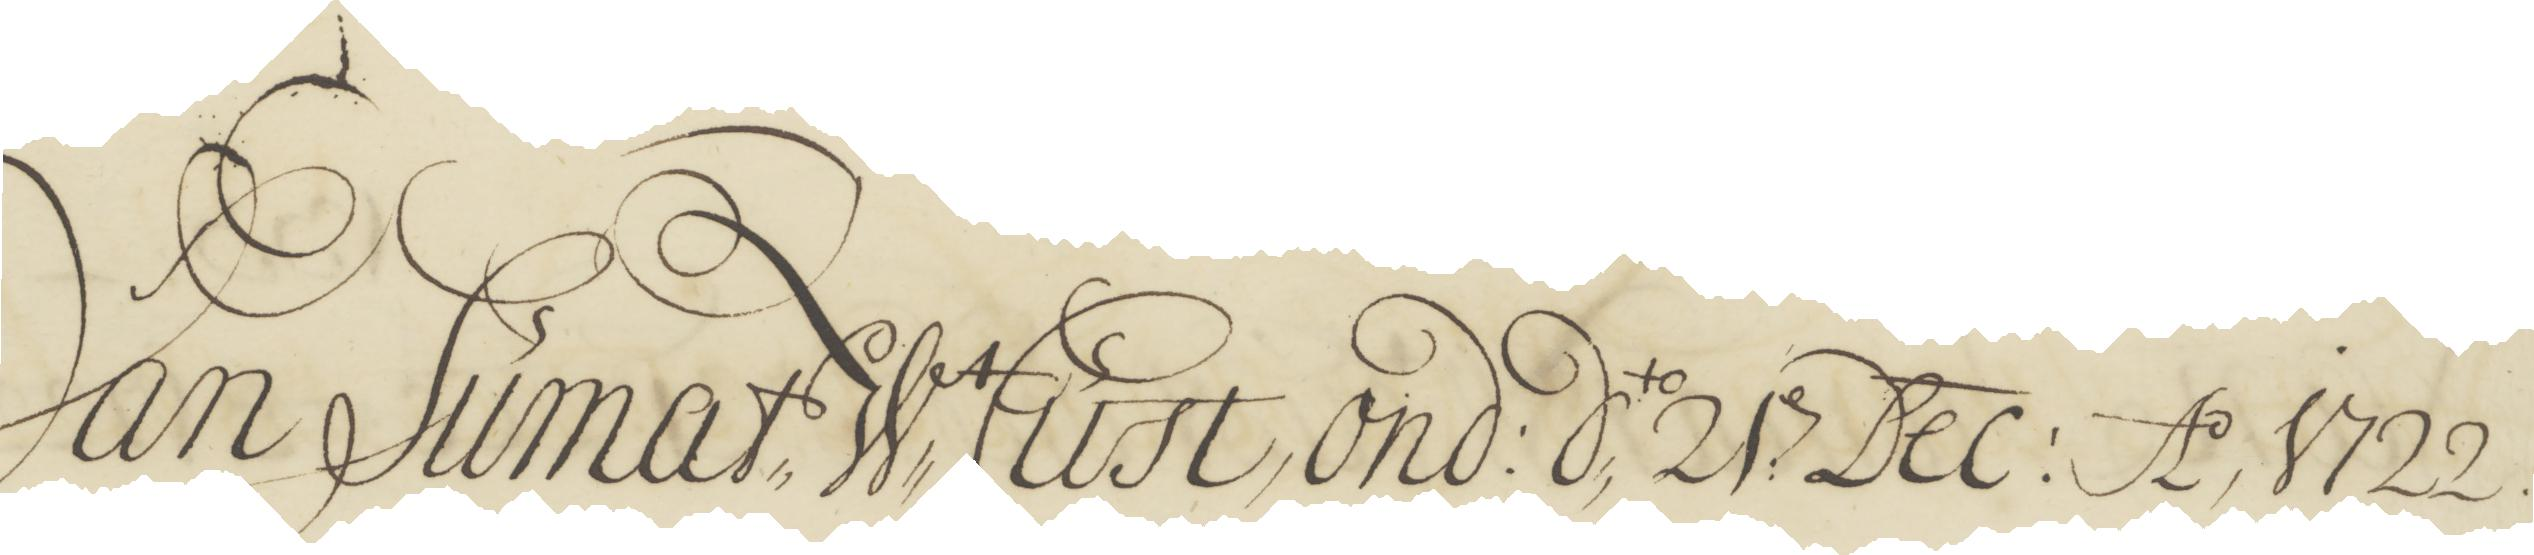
Van Sumat„s W„t Cust, ond: d„to 21:en Dec: Ao, 1722.
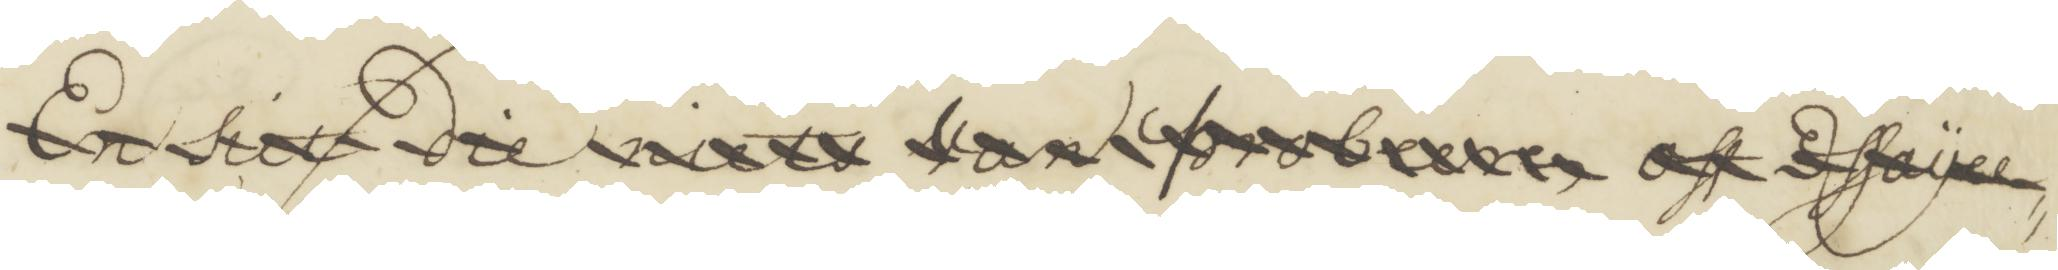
Et siet die niets van probeeren oft Essaijee„
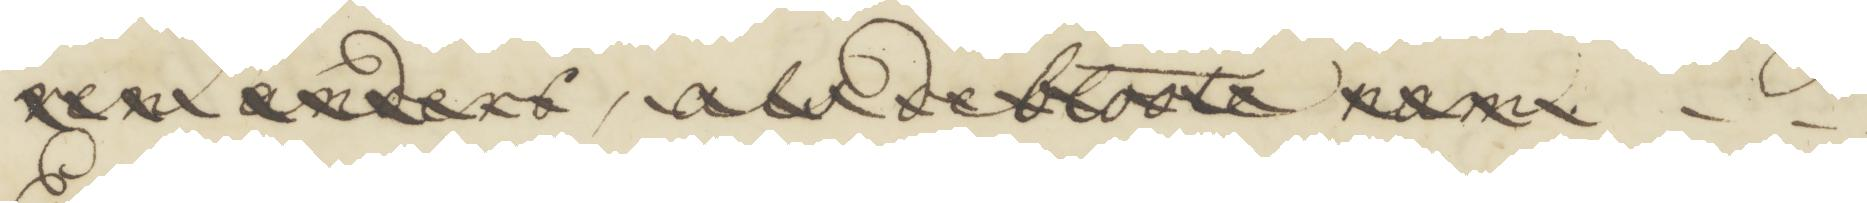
ren anders, als de bloote nam. – –
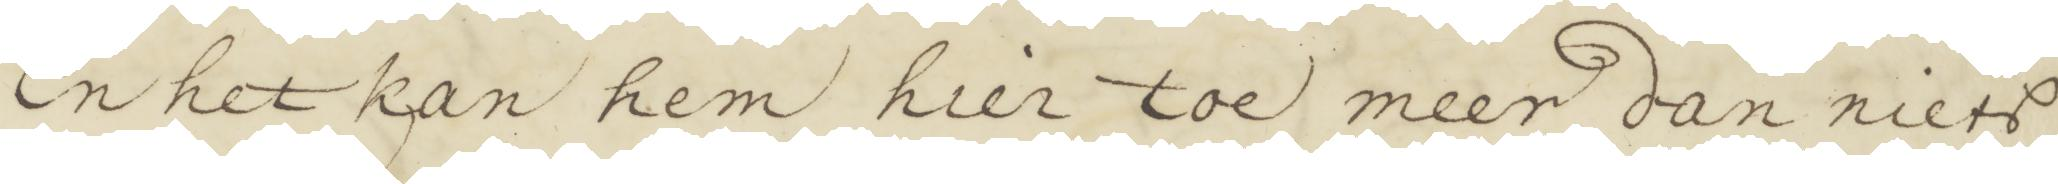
En het kan hem hier toe meer dan niets
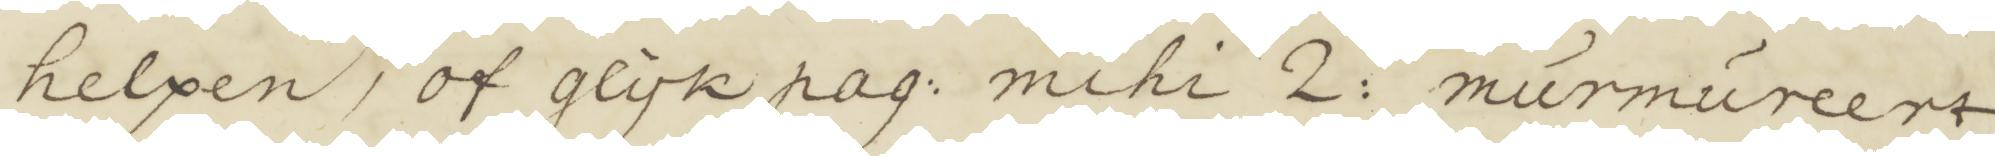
helpen, of glijk pag: mihi 2: murmureert
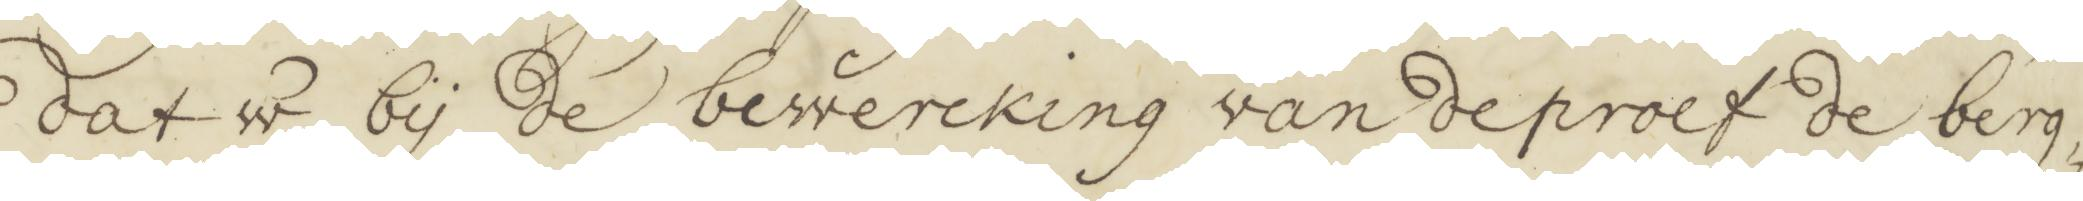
dat w' bij de bewercking van de proef de berg„
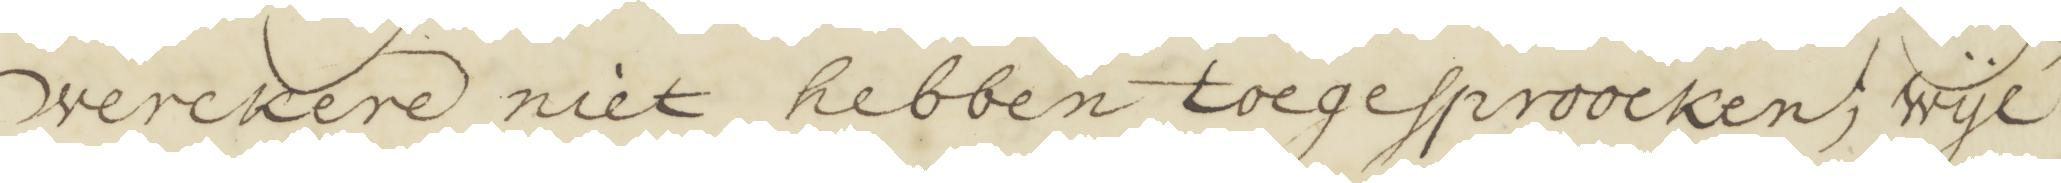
werckere niet hebben toegesproocken; wijl
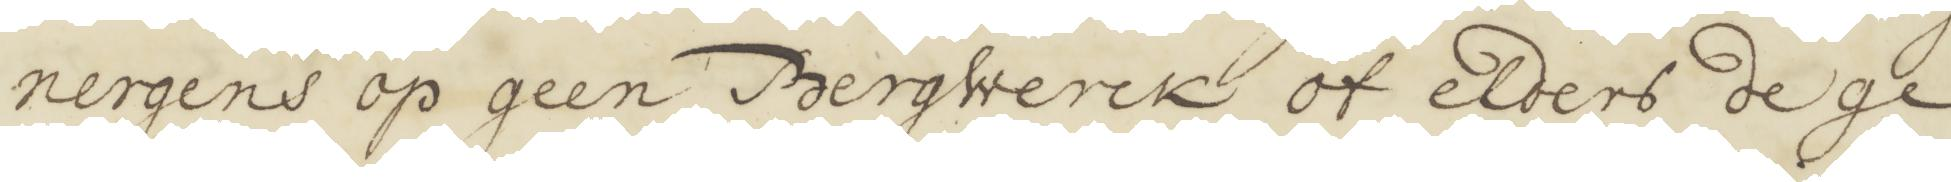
nergens op geen Bergwerck of elders de ge
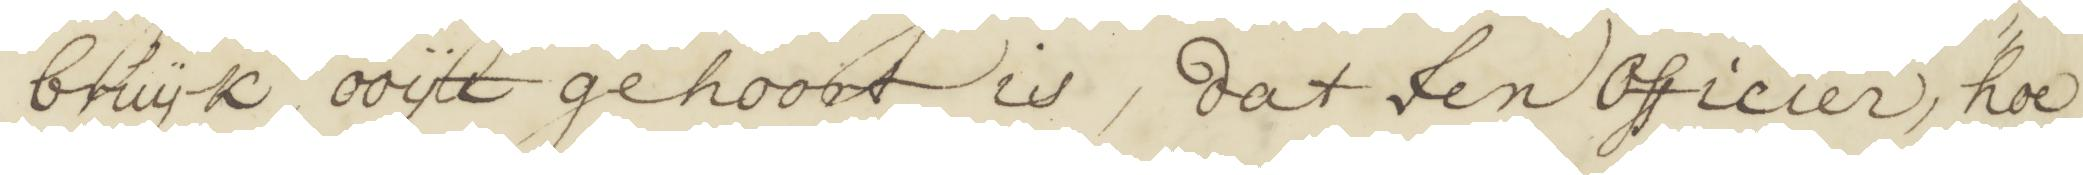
bruijk ooijt gehoort is, dat Een officier, hoe
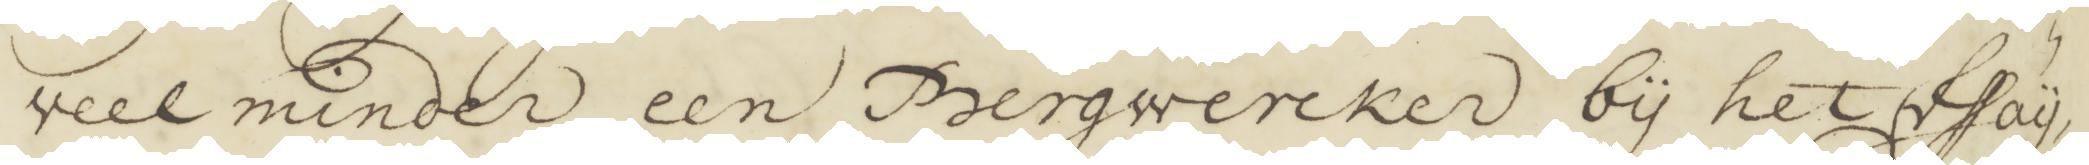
veel minder een Bergwercker bij het Essaij„
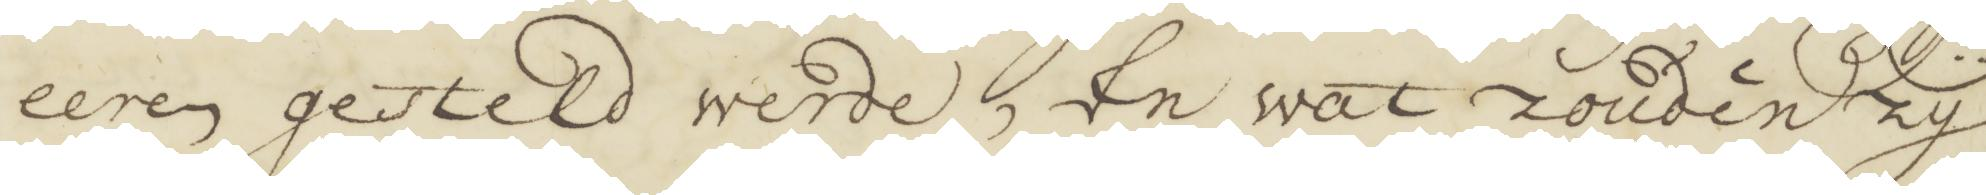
eeren gesteld werde, En wat zouden zij
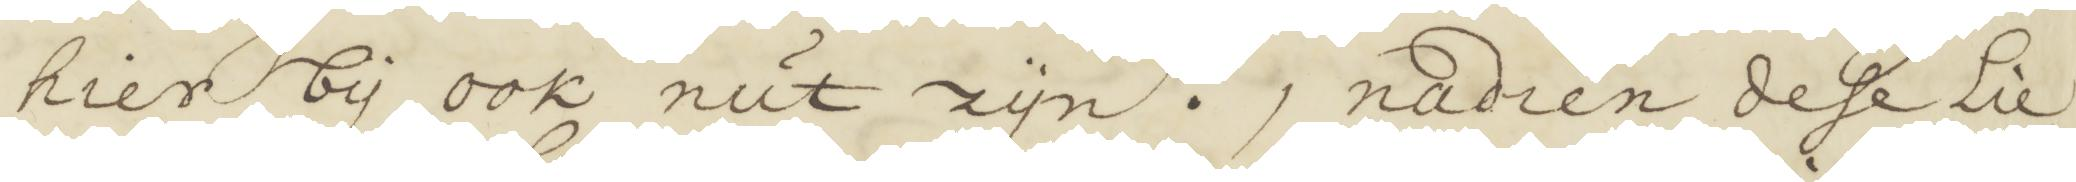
hier bij ook nut zijn? , nadien dese Lie
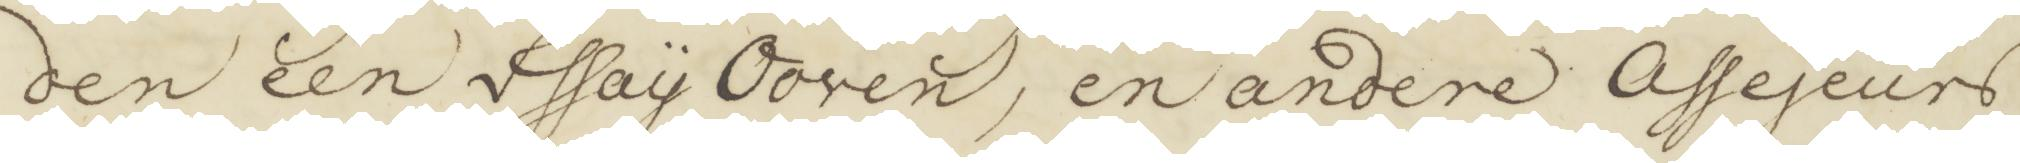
den een Essaij Ooven, en andere Assejeurs
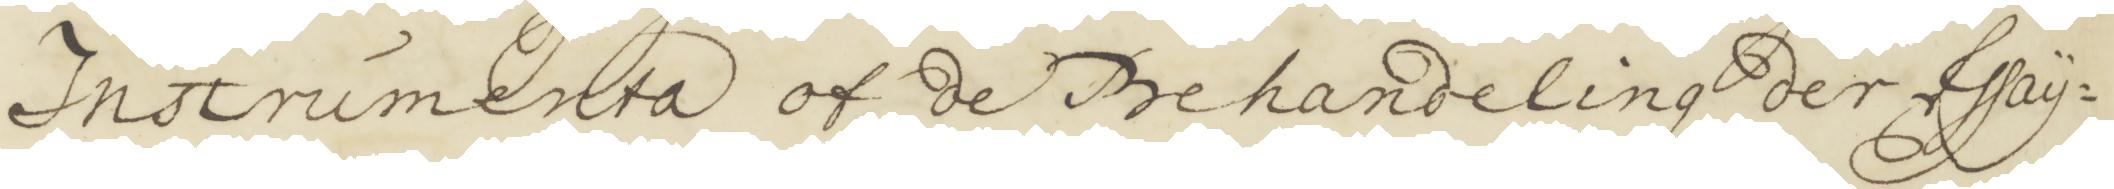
Instrumenta of de Behandeling der Essaij=
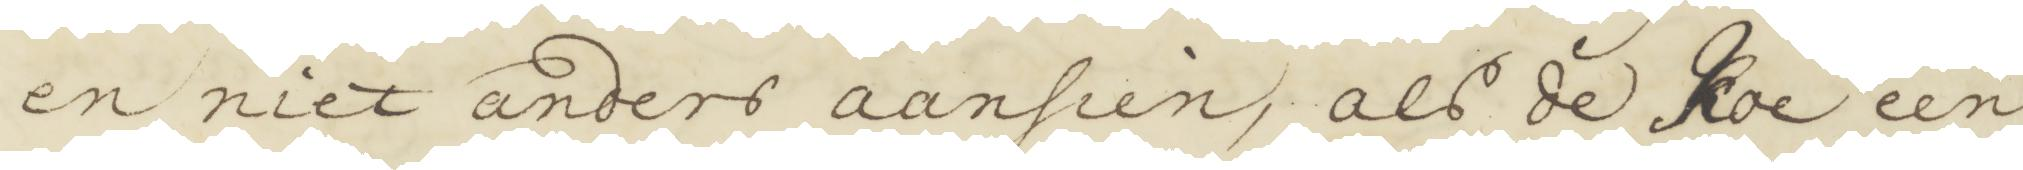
en niet anders aansien, als de koe een
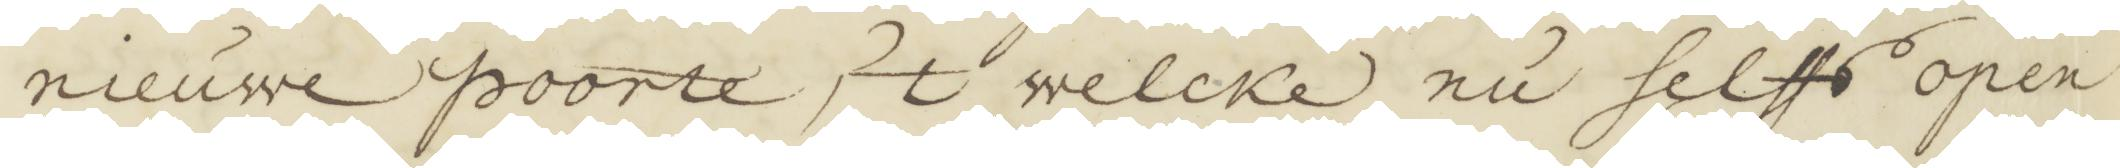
nieuwe poorte, ’t welcke nu selffs open
